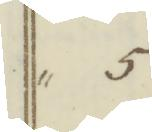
„ 5
